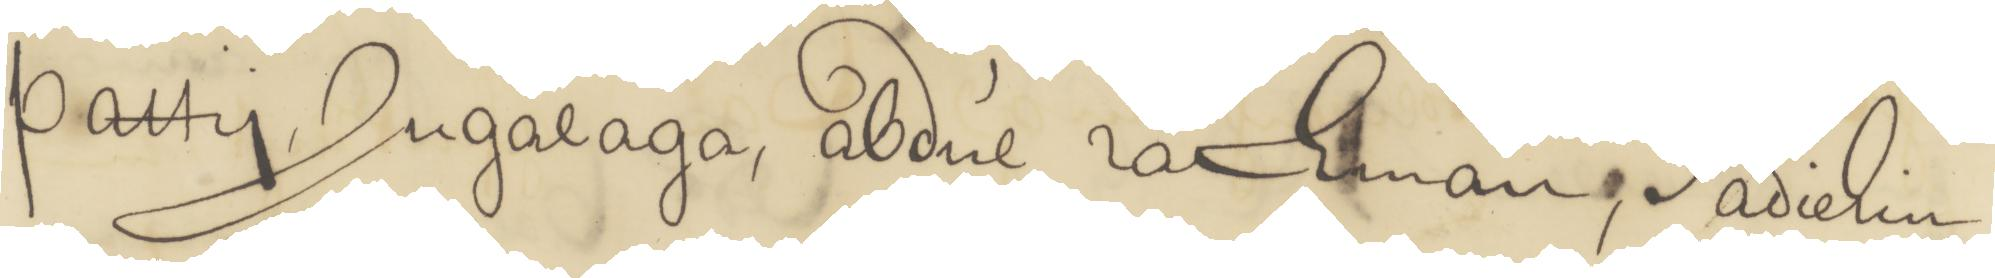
pattij, Jngalaga, abdul rachman, sadiehin
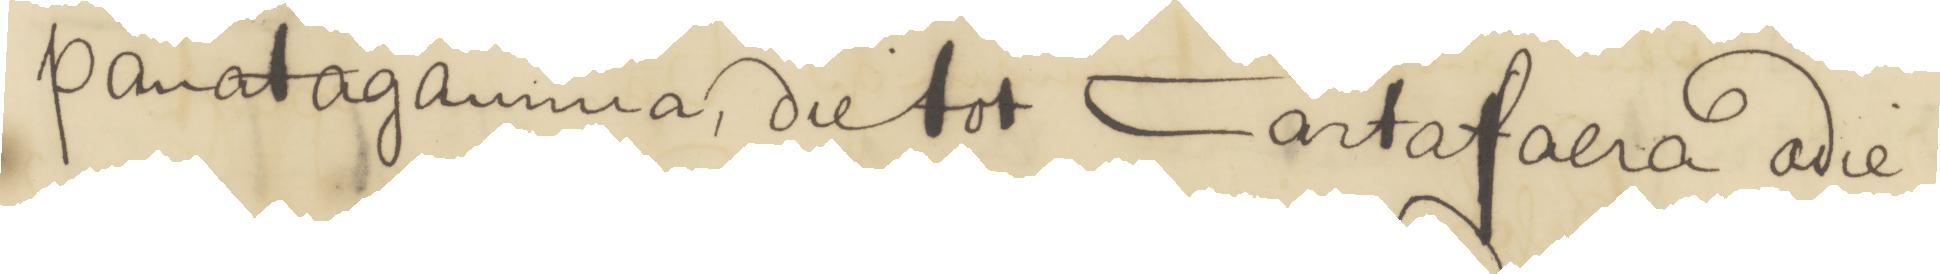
panatagamma, die tot cartafaera adie
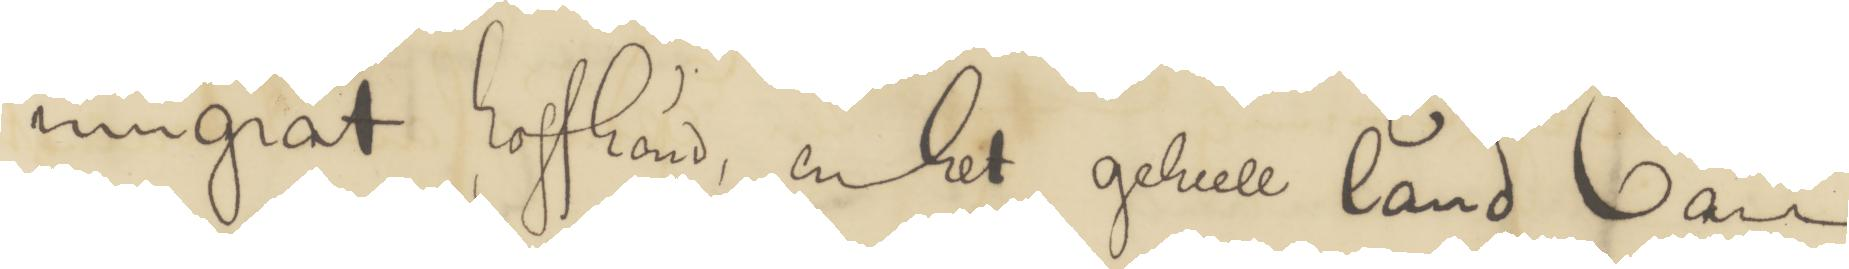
ningrat hoffhoud, en het geheele land van
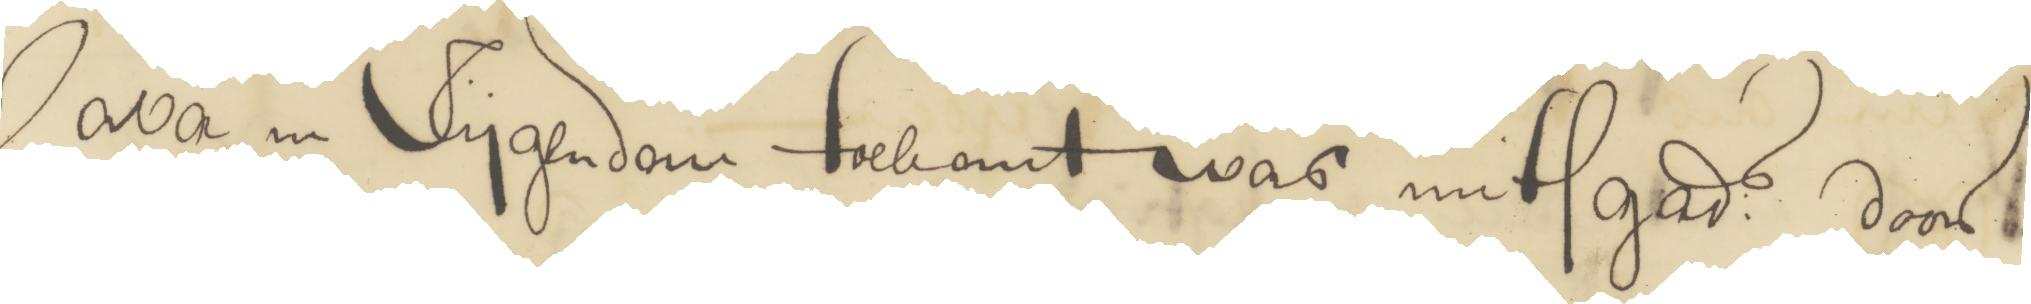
Java in Eijgendom toekomt was mitsgad:s door
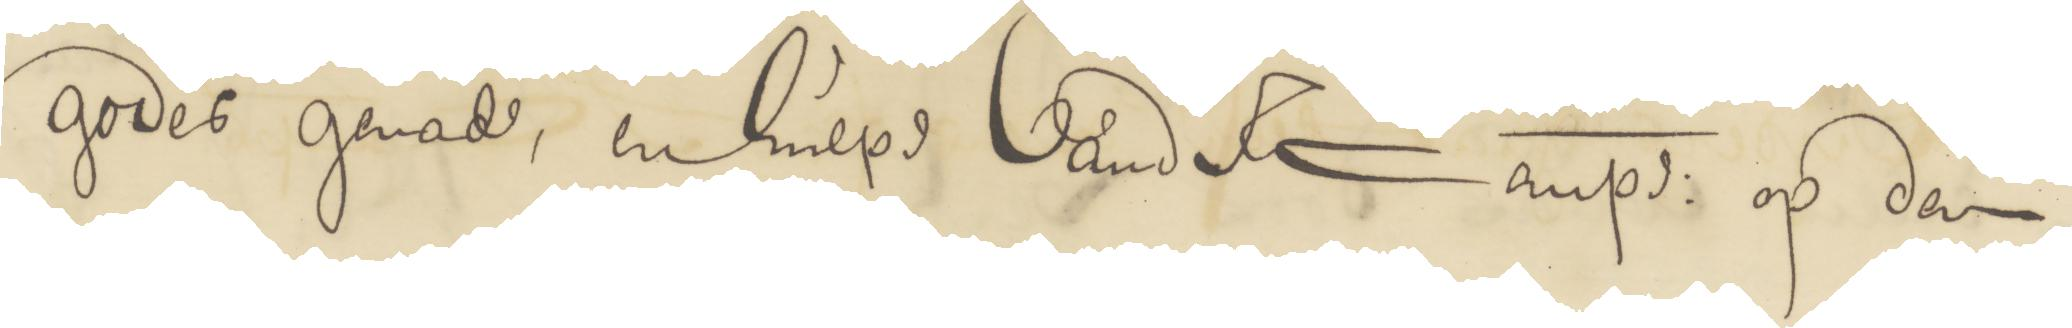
godes genade, en hulpe van d'Ecomps: op den
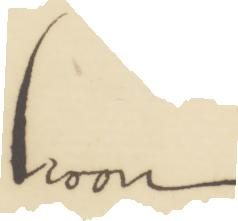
troon
